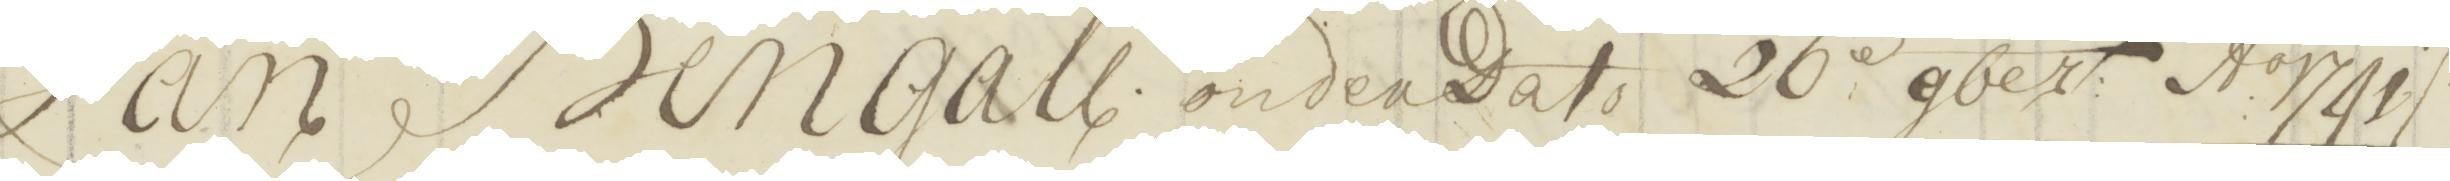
Van Bengale onder Dato 26:' 9ber: A:o 1741
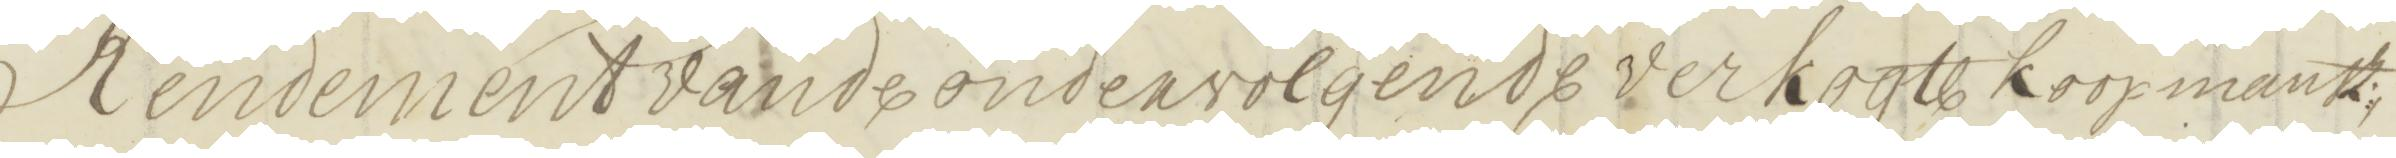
Rendement vande ondervolgende verkogte koopmansz:
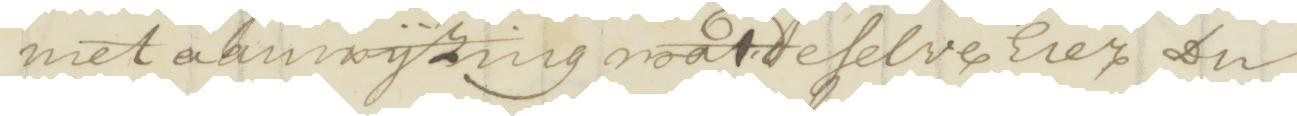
met aan wijzing wat deselve hier ten
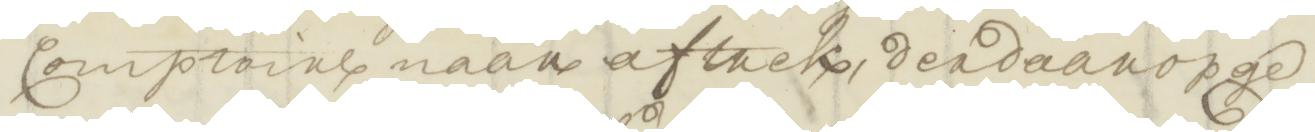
Comptoire naar aftrek, der daarop ge
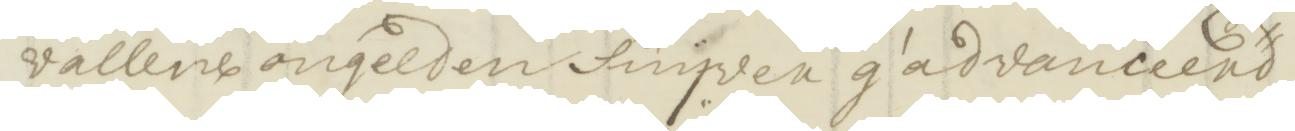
vallene ongelden suijver g’advanceerd
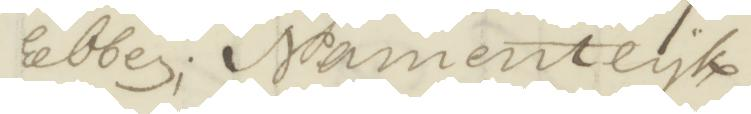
hebben; Namentlijk
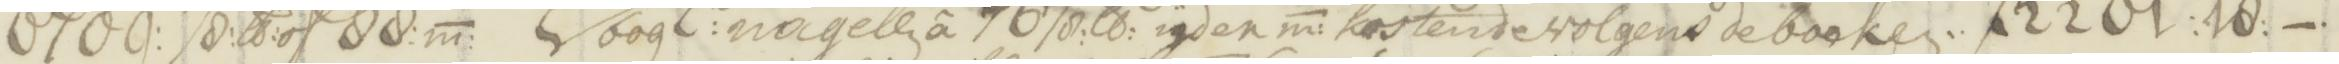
6709: 5/8: lb: of 88: m: 5 355/609 C:n nagelen â 76 1/8: lb: ijder m: kostende volgens de boeken.. ƒ2261: 18: —.
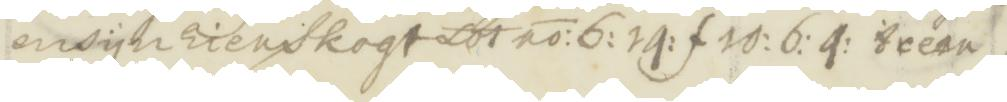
en sijn hier verkogt tot ro: 6: 14: ƒ 10: 6: 4: 8cent
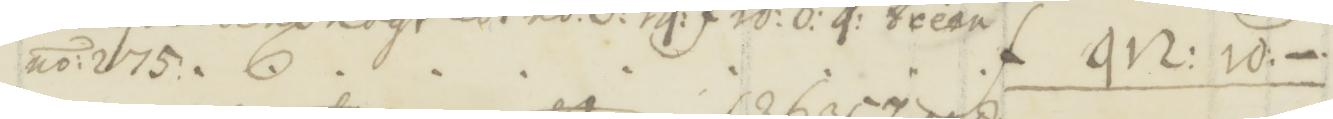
ro: 275.. . . . . . . . . . ƒ 412: 10: —
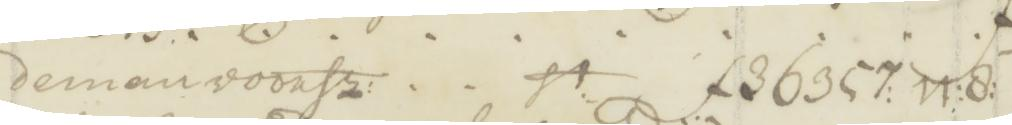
deman voorsz: . . st: ƒ 36357: 11: 8:
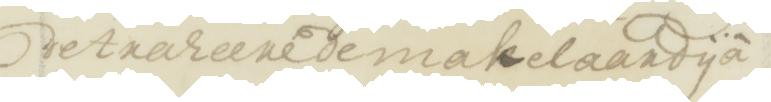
detraheere de makelaardijâ
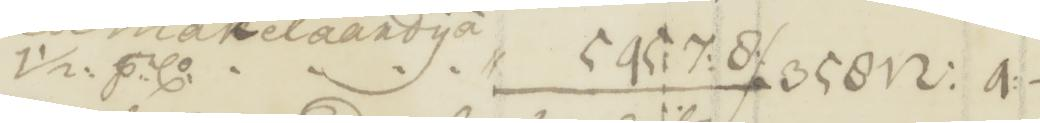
1½: p„rC:o . . . . „ 545: 7: 8: ƒ 35812: 4:
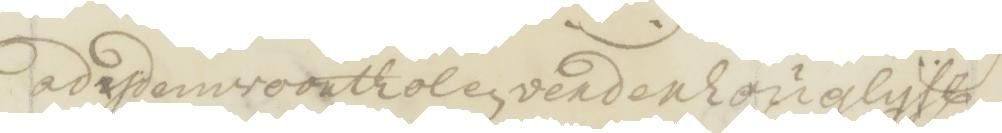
ad jdemvoortholen verderhouglijse
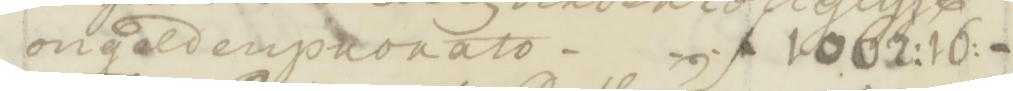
ongeldenprorato - - . ƒ 1062: 16:-
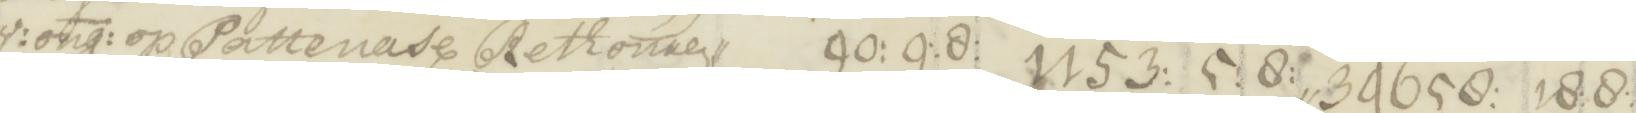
v: ong: op Pattenase Rethouren„ 90: 9: 8:„ 1153: 5: 8: „ 34658: 18: 8:
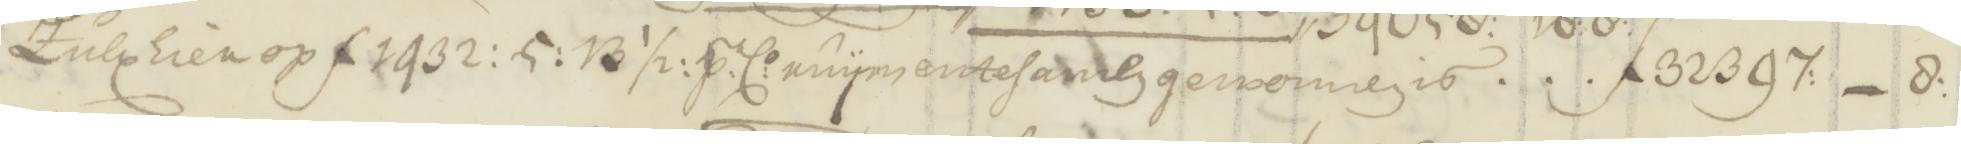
Zulx hier op ƒ 1432: 5: 13½: p:r C:o ruijm en tesamen gewonnen is . . . ƒ 32397: — 8:
